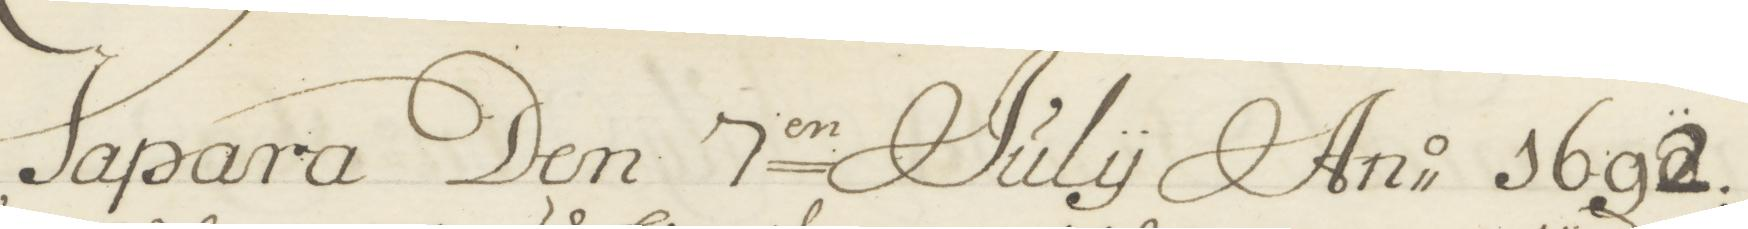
Japara Den 7=en Julij An„o 1692.
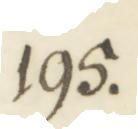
195.
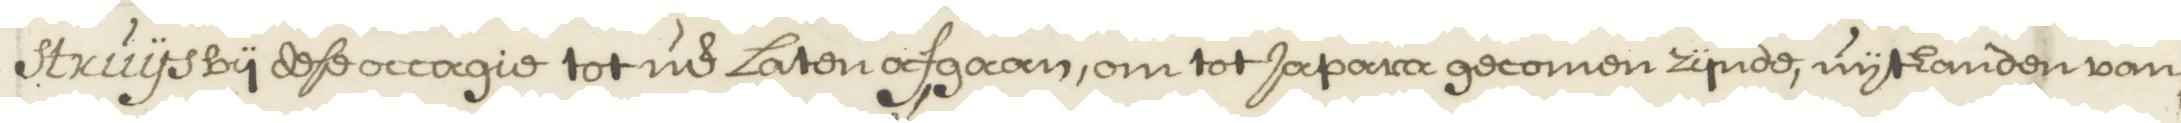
Struijs bij dese occagie tot uE laten afgaan, om tot Japara gecomen zijnde, uijt handen van
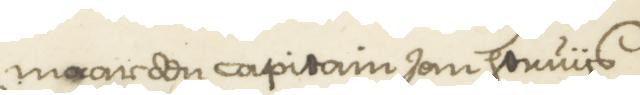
maar den capitain Jan Struijs
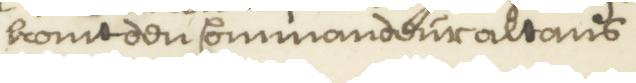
komt den Commandeur altans
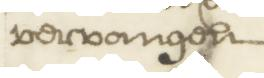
vervangen
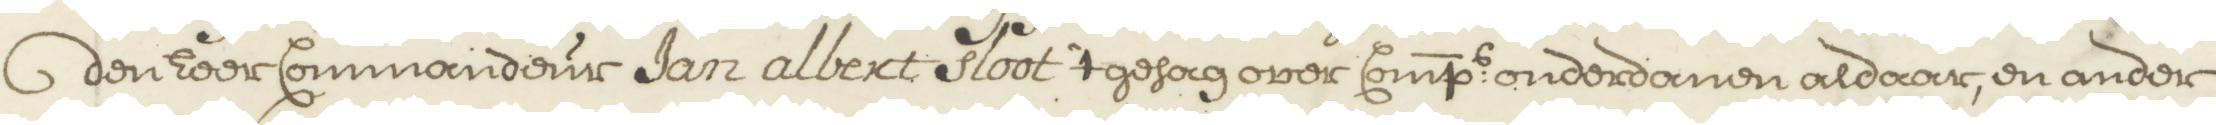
den heer Commandeur Ian albert sloot ’t gesag over Comp:s onderdanen aldaar, en ander
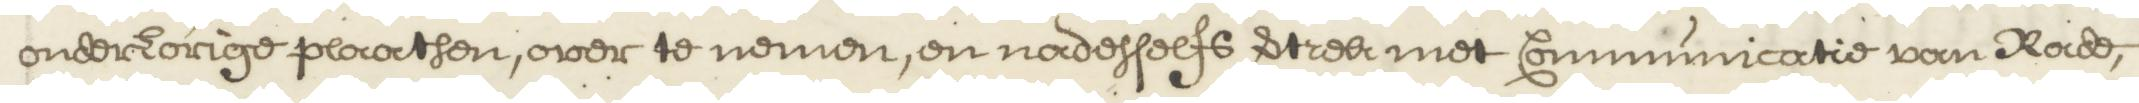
onderhorige plaatsen, over te nemen, en nadesselfs vertrek met Communicatie van Rade,
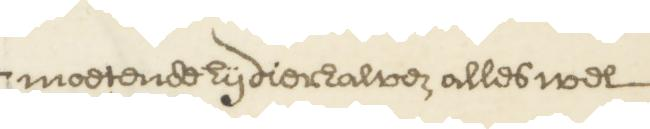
moetende hij dierhalven alles wel
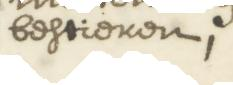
bestieren,
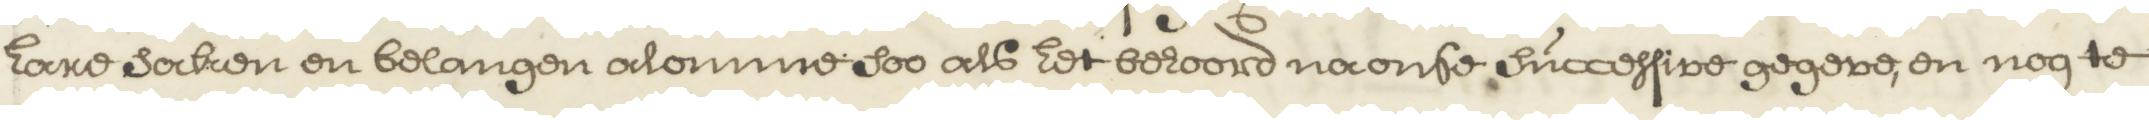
hare sacken en belangen alomme soo als het behoord na onse successive gegeve, en nog te
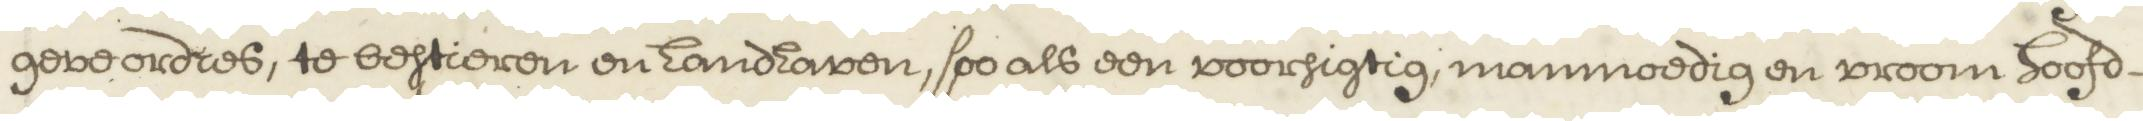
geve ordres, te bestieren en handhaven, soo als een voorsigtig, manmoedig en vroom hoofd
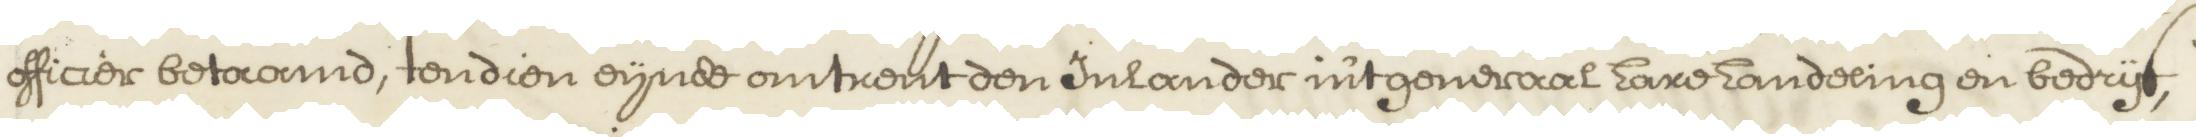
officier betaamd, ten dien eijnde omtrent den Inlander in’t generaal hare handeling en bedrijf,
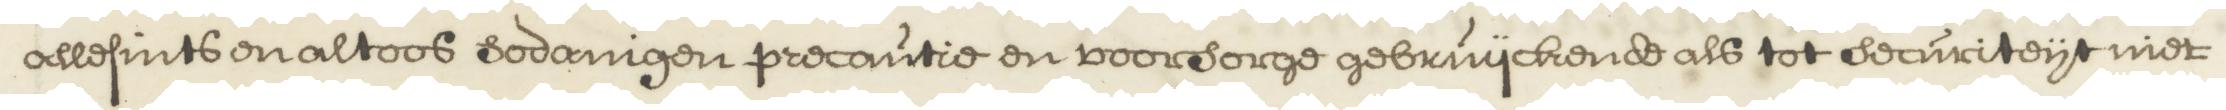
allesints en altoos sodanigen precautie en voorsorge gebruijcken de als tot securiteijt niet
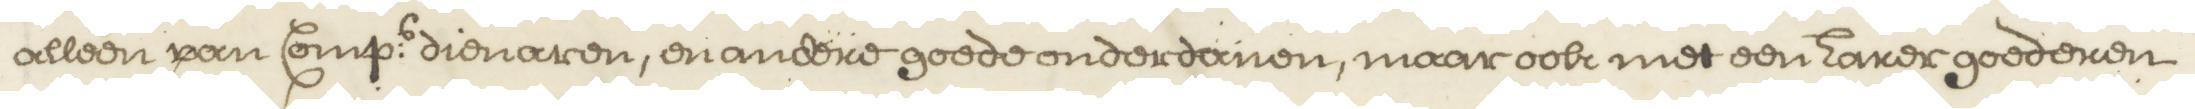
alleen van Comp:s dienaren, en andere goede onderdanen, maar ook met een harer goederen
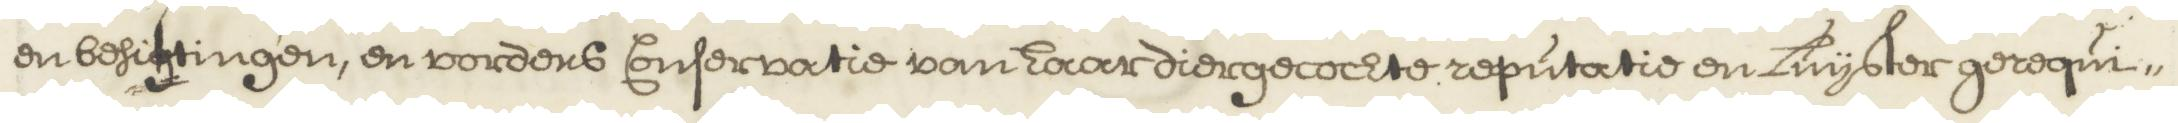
en besittingen, en vorders Conservatie van haar dier gecochte reputatie en Luijster gerequi„
